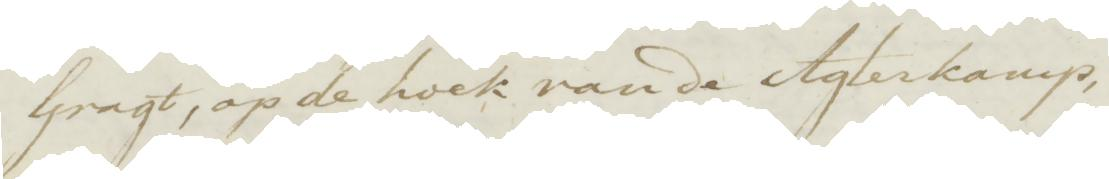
Gragt, op de hoek van de Agterkamp,
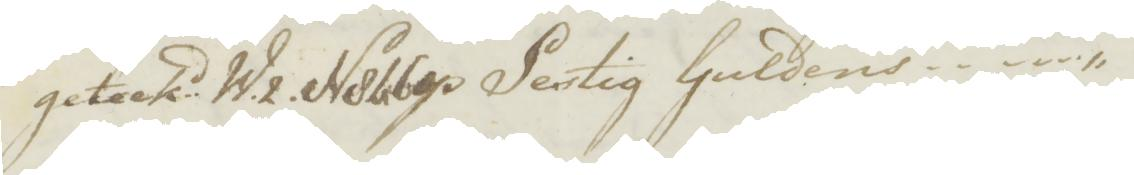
geteek.. W.2. N 846 op Sestig Guldens - - - - - - „
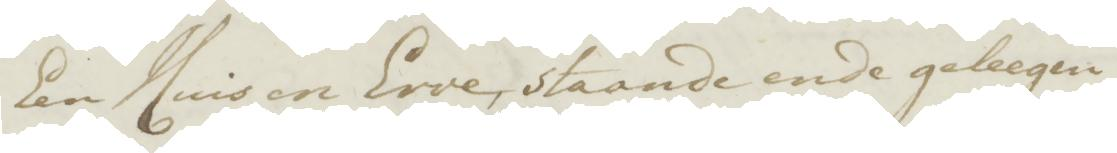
Een Huis en Erve, staande ende geleegen
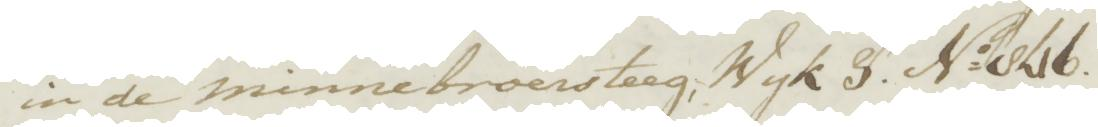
in de minnebroersteeg, Wyk 3. N=o 846.
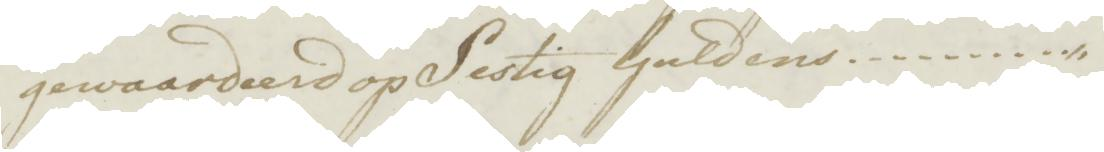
gewaardeerd op Sestig Guldens - - - - - - - - - - „
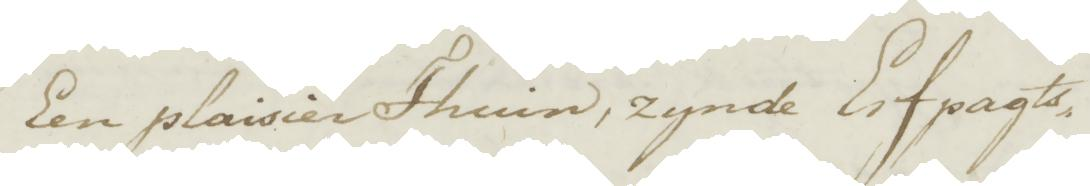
Een plaisier Thuin, zynde Erfpagts„
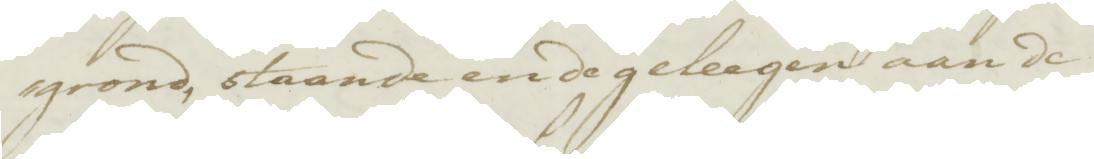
„grond, staande ende geleegen aan de
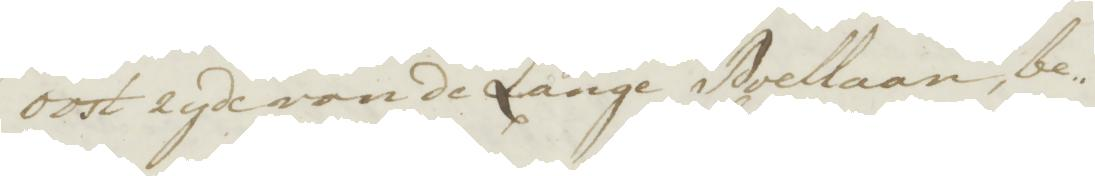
oost zyde van de Lange Poellaan, be„
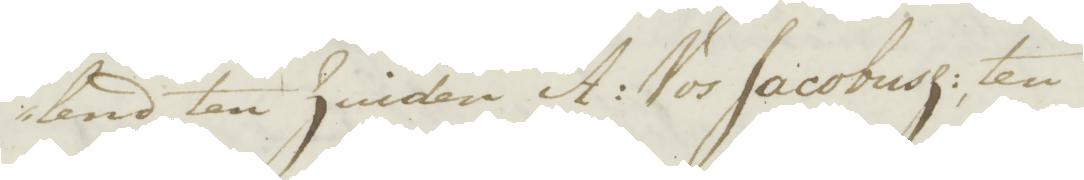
„lend ten Zuiden A: Vos Jacobusz:, ten
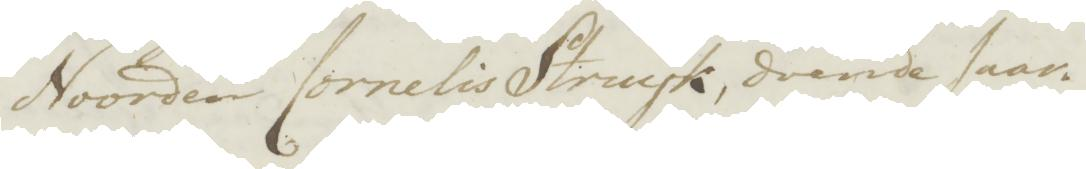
Noorden Cornelis Struyk, doende Jaar.
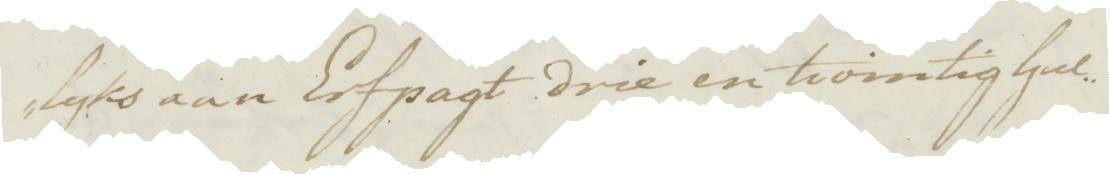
„lijks aan Erfpagt drie en twintig Gul„
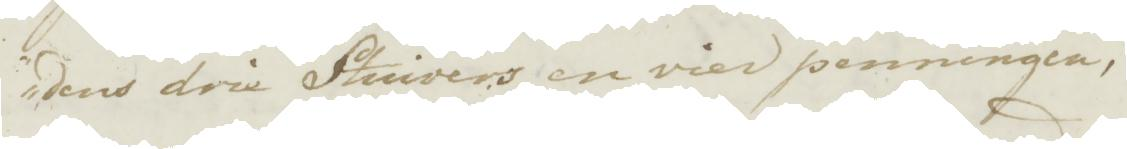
„dens drie Stuivers en vier penningen,
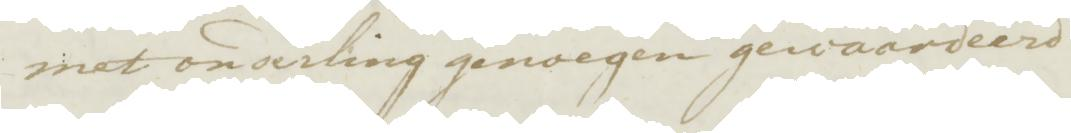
met onderling genoegen gewaardeerd
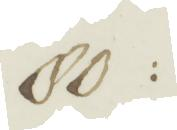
80:
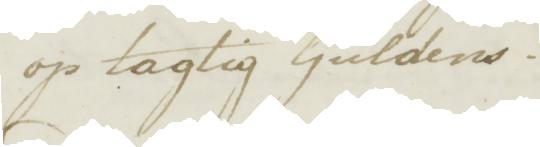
op tagtig Guldens
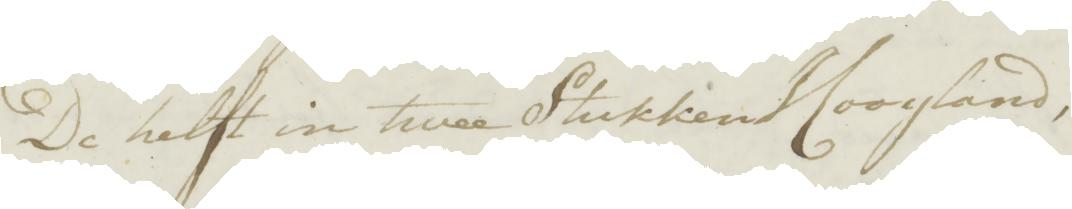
De helft in twee Stukken Hooyland,
